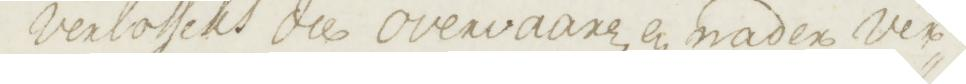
verlossers die overvaaren en nader ver„
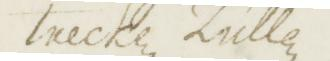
trecken zullen
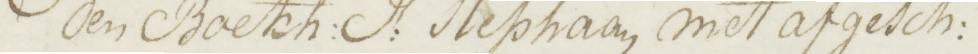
den Boekh: F: Stephaan met afgesch:
